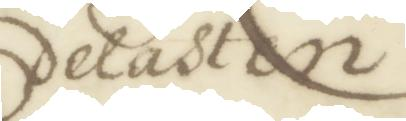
delasten
